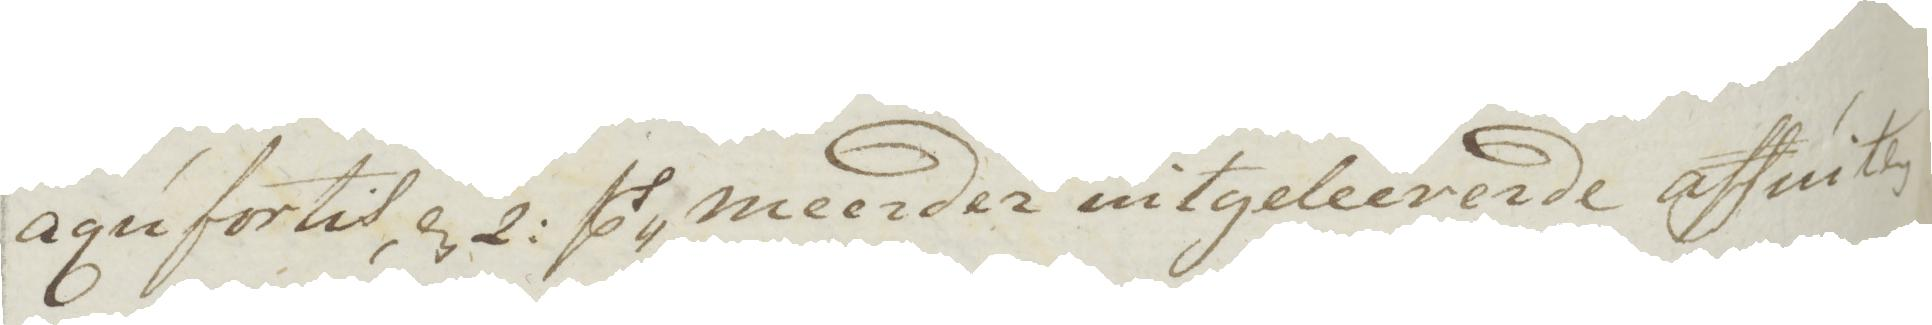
aqufortis, en 2: p„s meerder uitgeleeverde affuiten
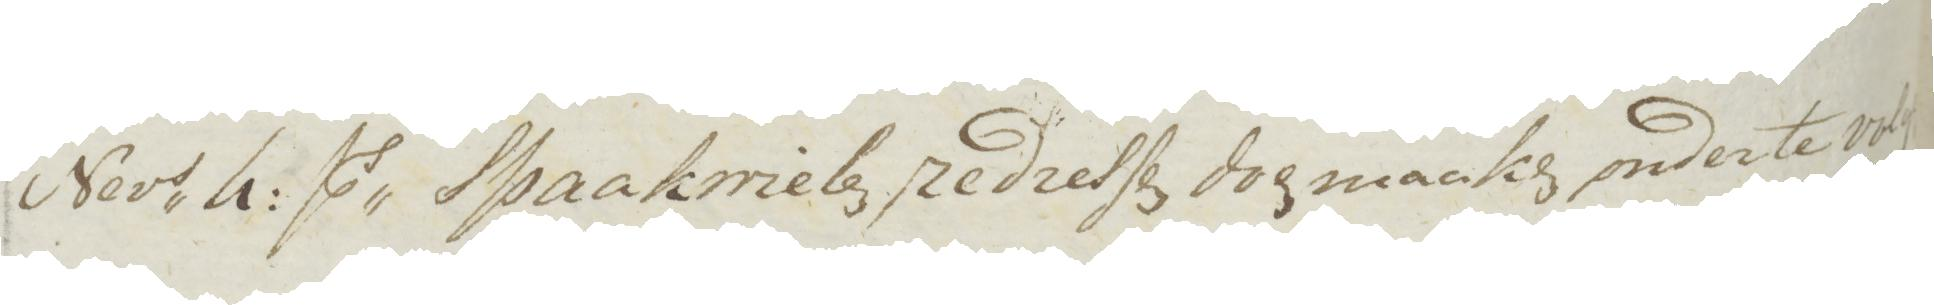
Nev:s 4: p„s spaakwielen, redressen doen maaken onderte volg
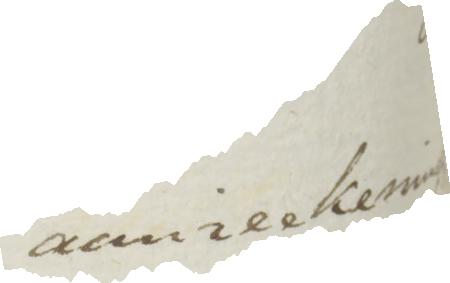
aanreekening
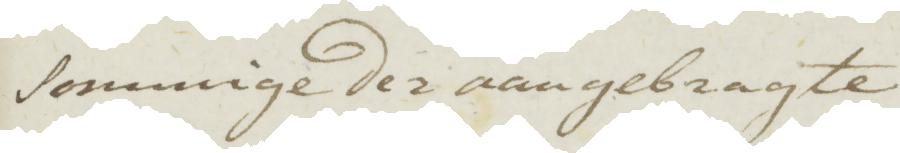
sommige der aangebragte
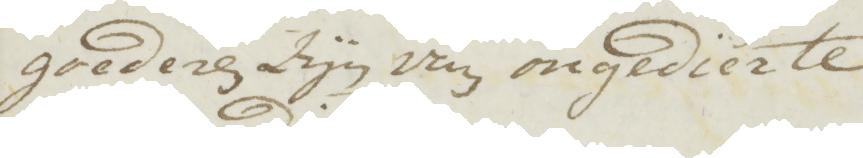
goederen zijn van ongedierte
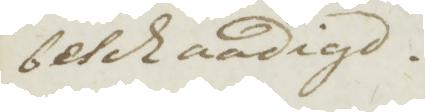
beschaadigd.
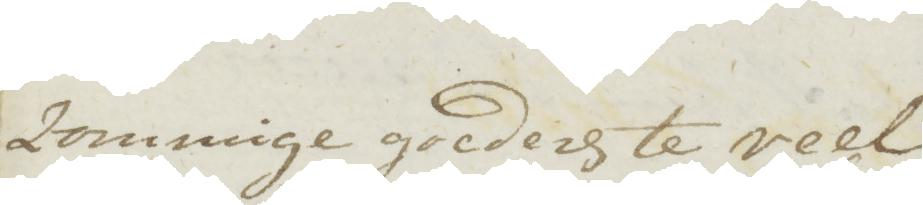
zommige goederen te veel
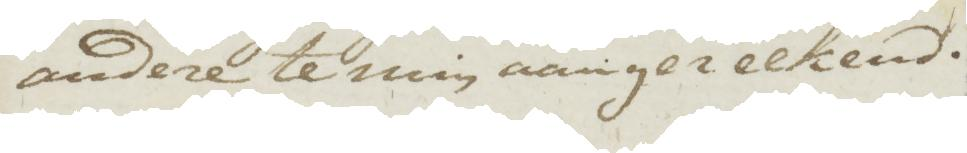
andere te min aangereekend.
